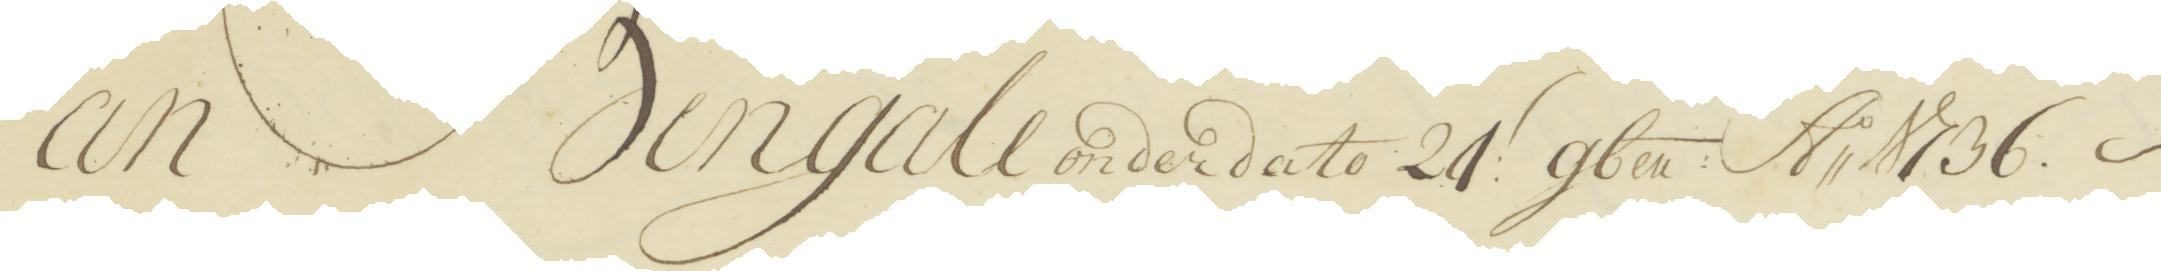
Van Bengale onder dato 24:' 9ber: A„o 1736:
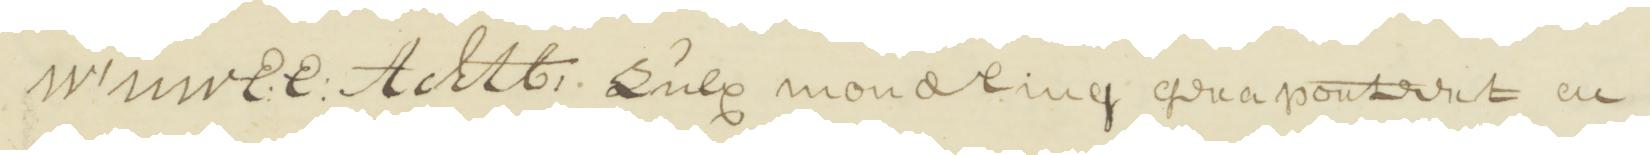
w' uw E:E: Achtb: zulx mondeling geraporteert en
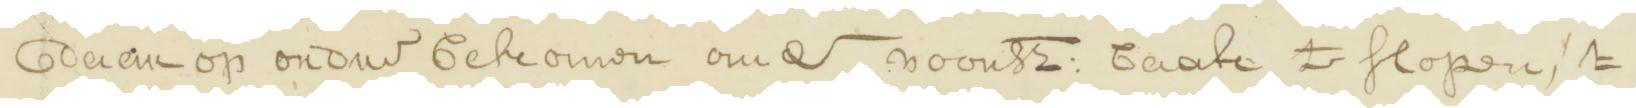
daar op ordre bekomen om de voorsz: saak te slopen, 't
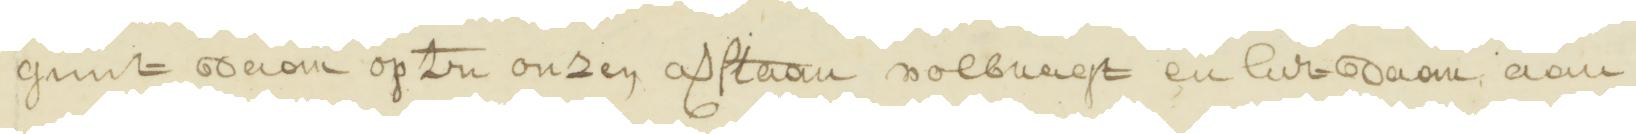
gunt daar op ten onzen overstaan volbragt en het daar aan
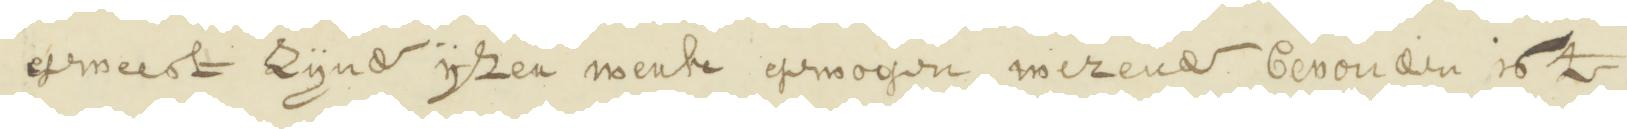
geweest zijnde ijzer werk gewogen wezende bevonden is te
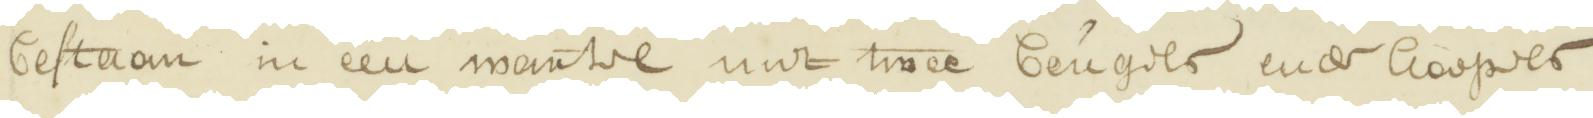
bestaan in één mantel met twee beugels en de koepels
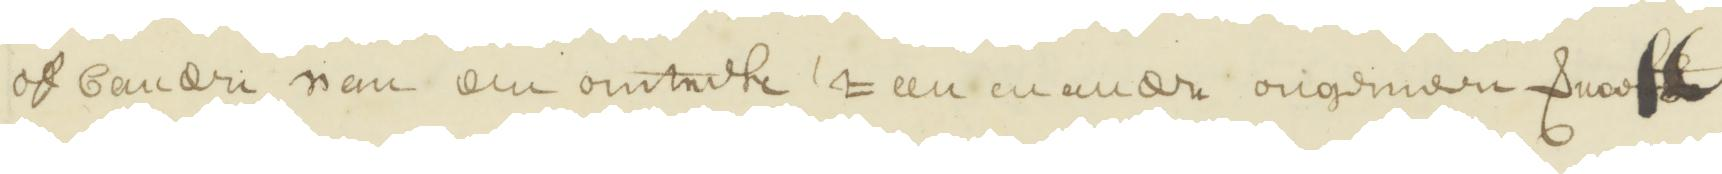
of banden van den omtrek 't een en ander ongemeen verroeft
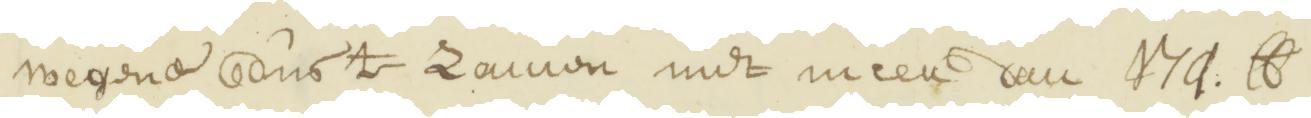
wegend dus te zamen met meer dan 474: lb
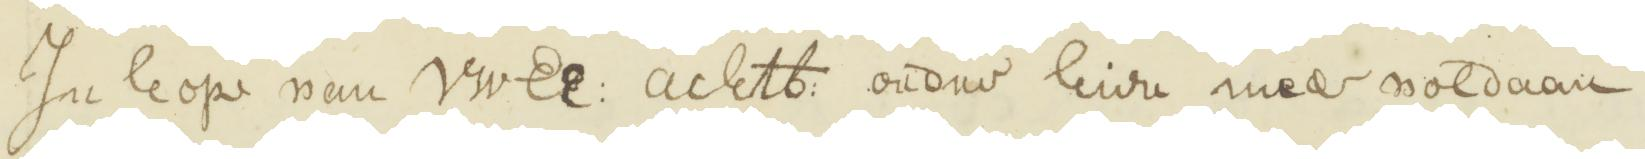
Jn hope van VW EE: achtb: ordre hier mede voldaan
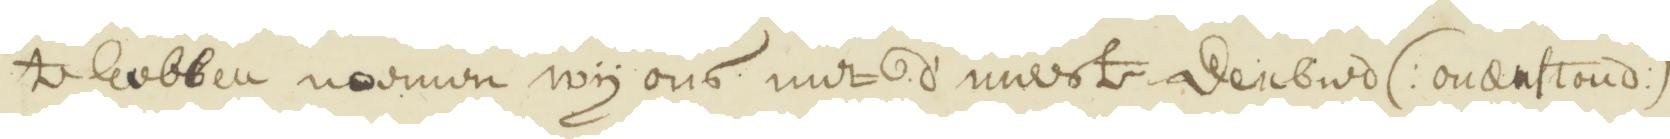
te hebben noemen wij ons met d’ meeste Eerbied (:onderstond:
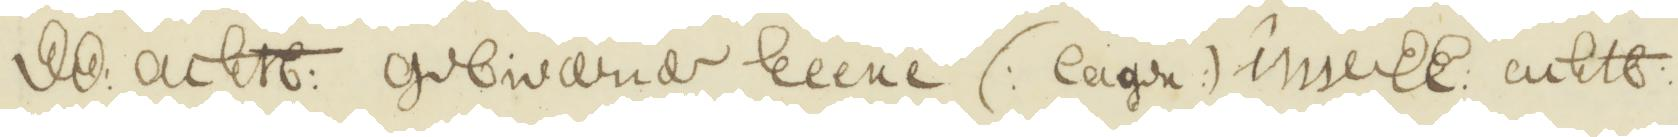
EE: achtb: gebiedende heere (:lager:) UW EE: achtb:
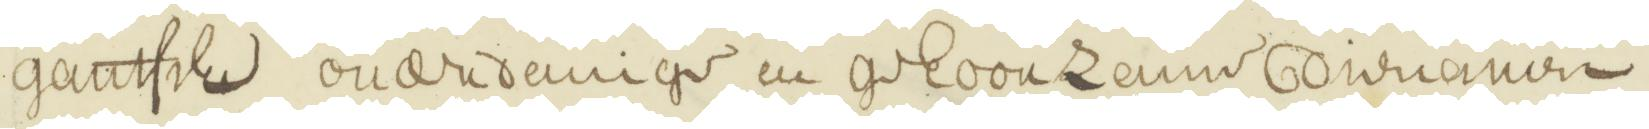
gantsche onderdanige en gehoorzame dienaren
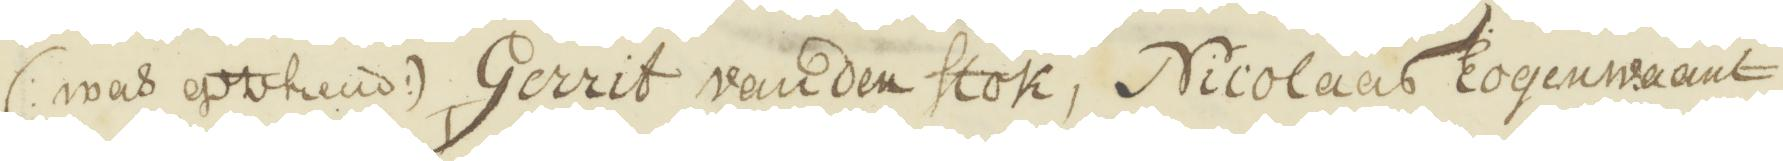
(:was getekend:) Gerrit van der stok, Nicolaas hogerwaart
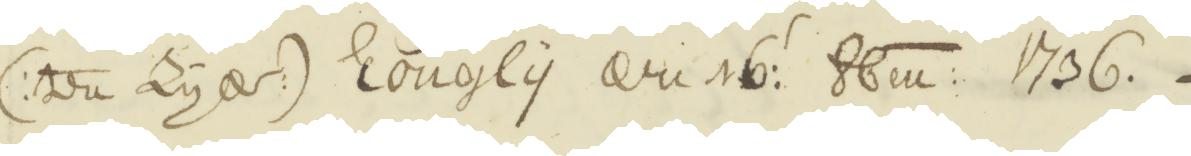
:ter zijde:) houglij den 16:' 8ber: 1736.
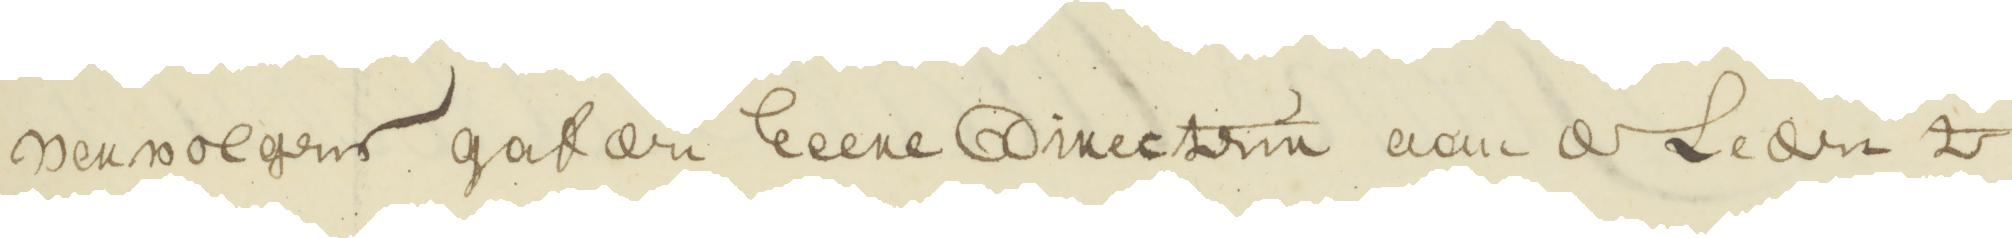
vervolgens gaf den heere directeur aan de Leden te
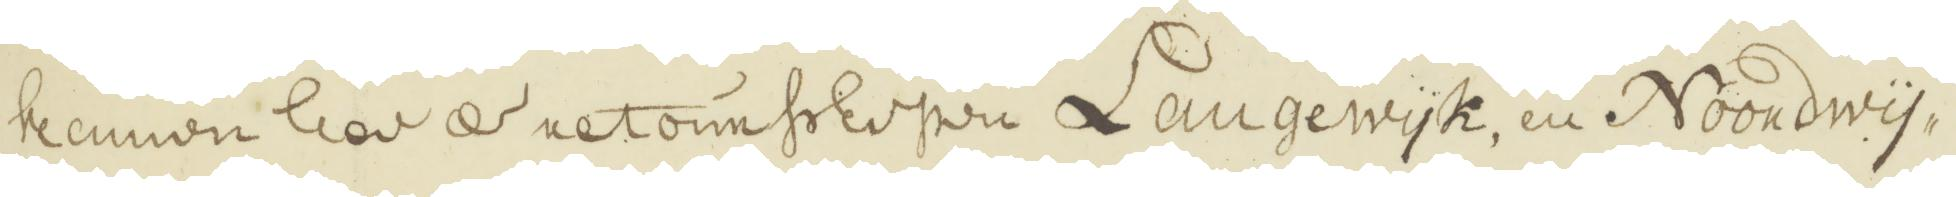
kennen hoe de retourschepen Langewijk, en Noordwij„
